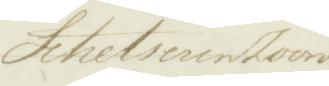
SchetzerenZoon
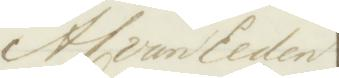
A C van Eeden
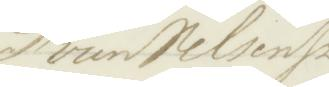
F van VelsenJr
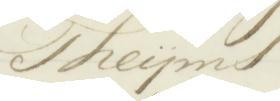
Theijms
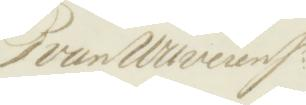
P vanWaverenJ:r
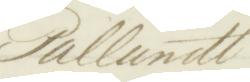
Pallandt
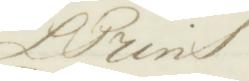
L Prins
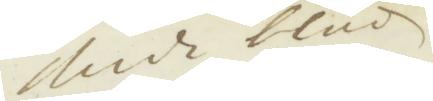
derde blad
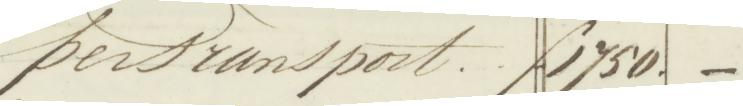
Per Transport . . f1750. —
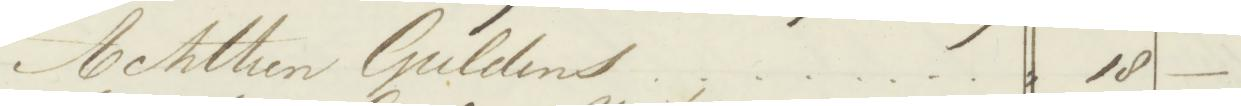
Achttien Guldens . . . . . . . . „ 18 —
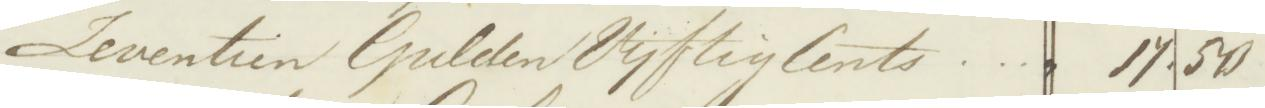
Zeventien Gulden Vijftig Cents . . . „ 17.50
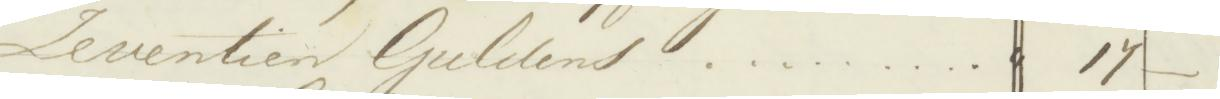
Zeventien Guldens . . . . . . . . . „ 17 —
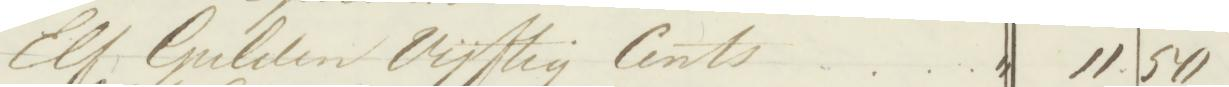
Elf Gulden Vijftig Cents . . . . „ 11.50
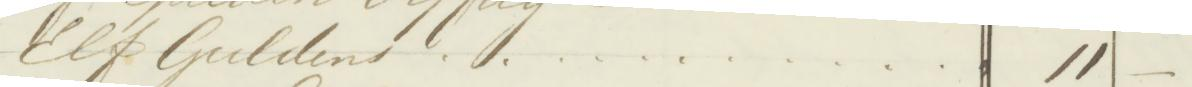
Elf Guldens . . . . . . . . . . . „ 11 —
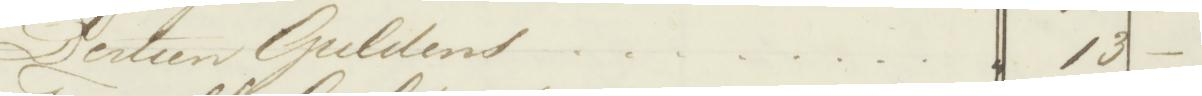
Dertien Guldens . . . . . . . . „ 13 —
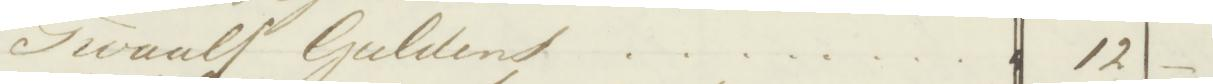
Twaalf Guldens . . . . . . . . „ 12 —
